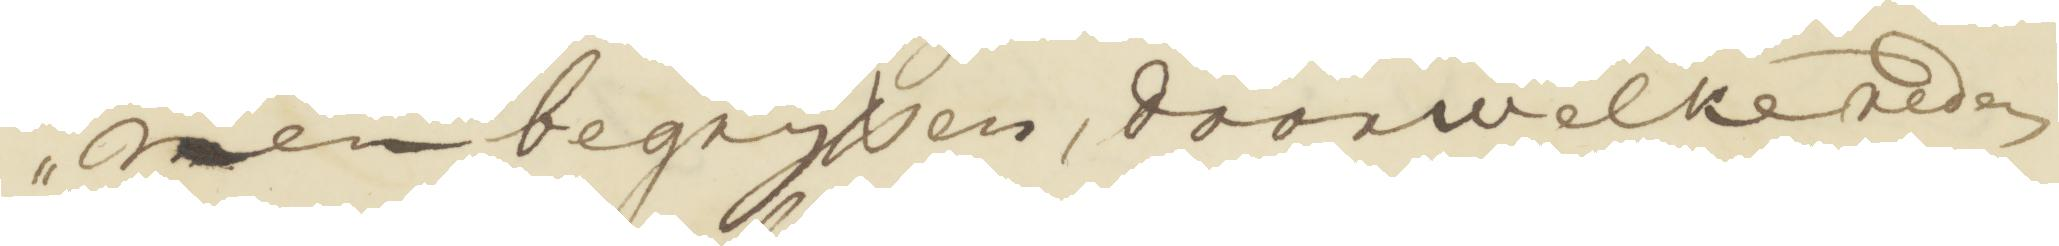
„nen begrijpen, doorwelke reden
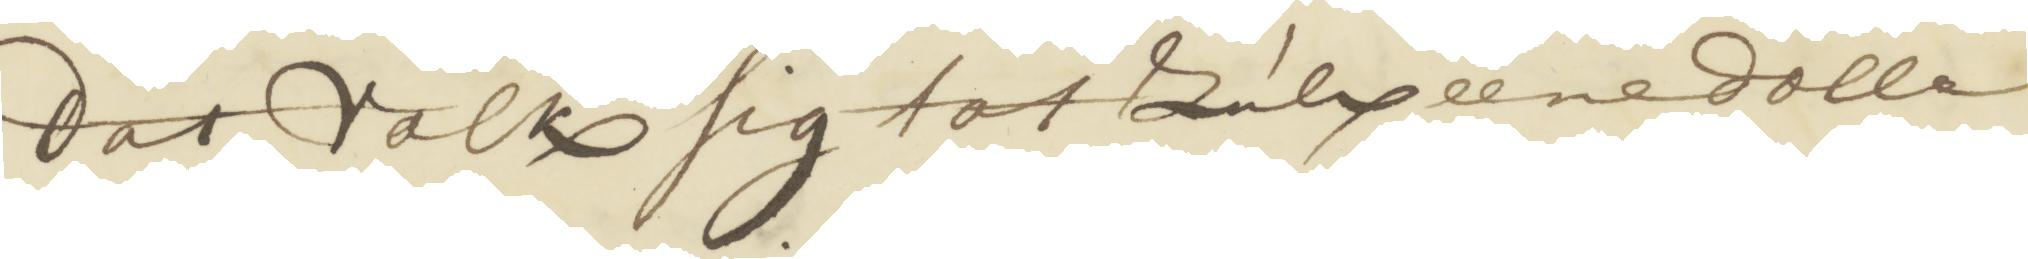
dat volk sig tot zulx eene dolle
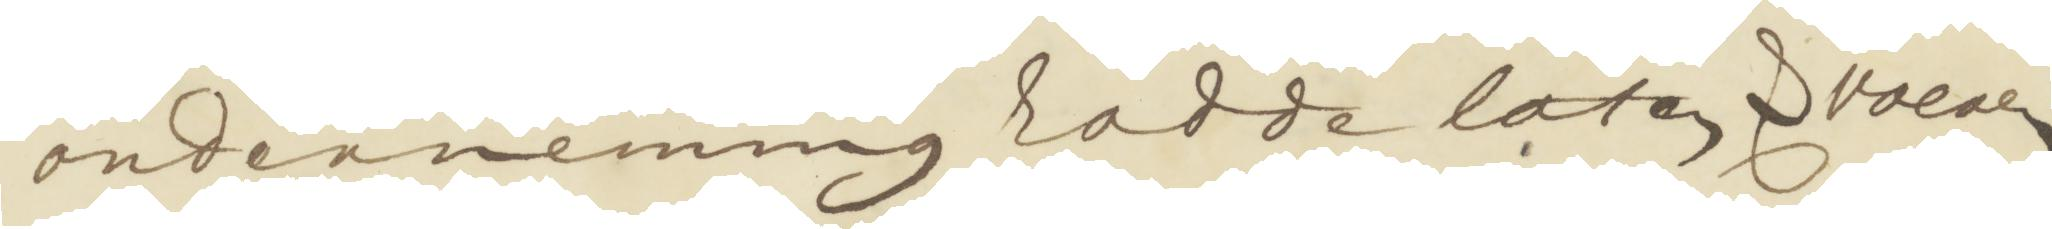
onderneming hadde laten vervoeren
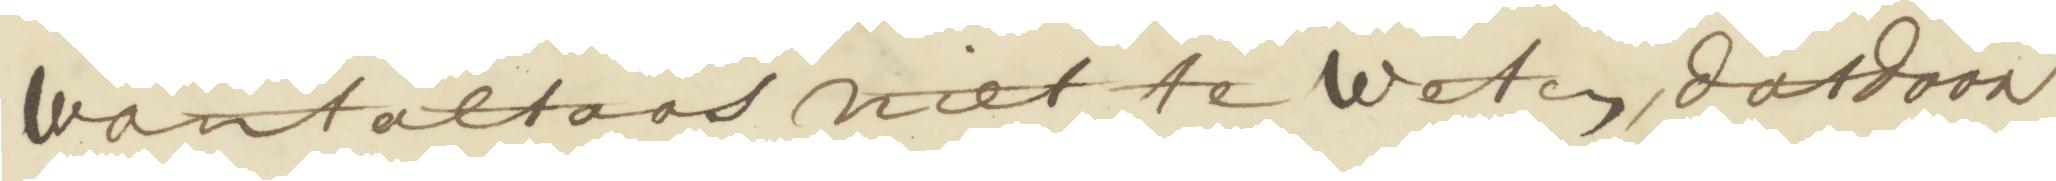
want altoos niet te weten, dat door
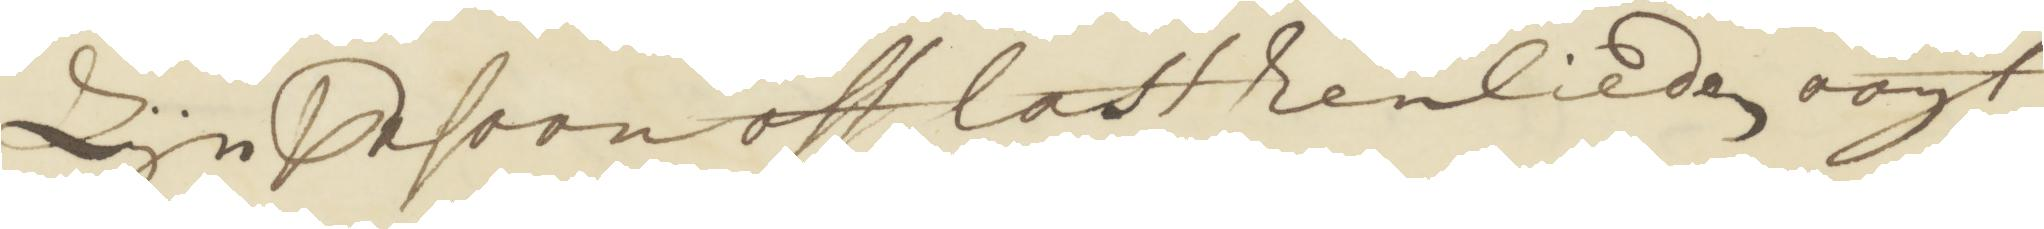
zijn persoon off lasthenlieden ooijt
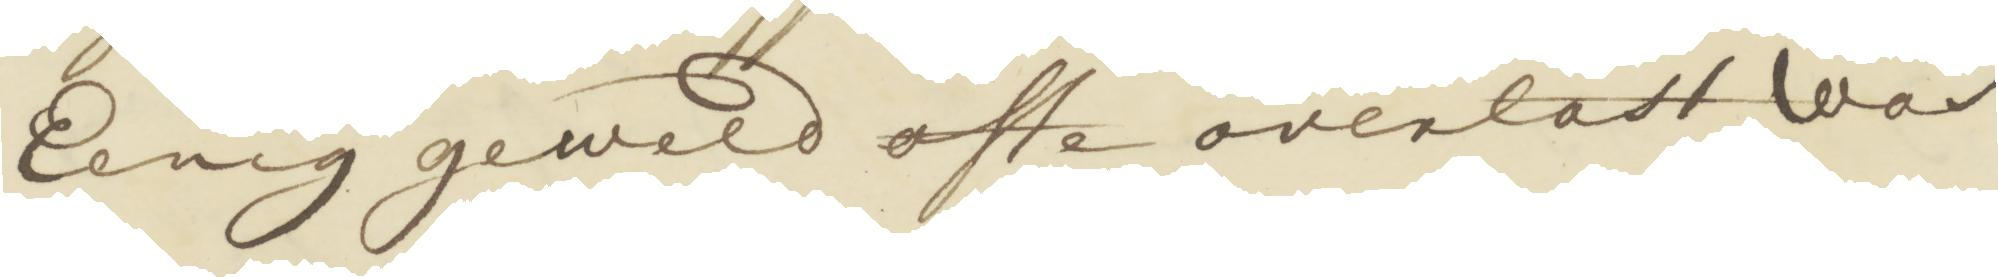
Eenig geweld ofte overlast was
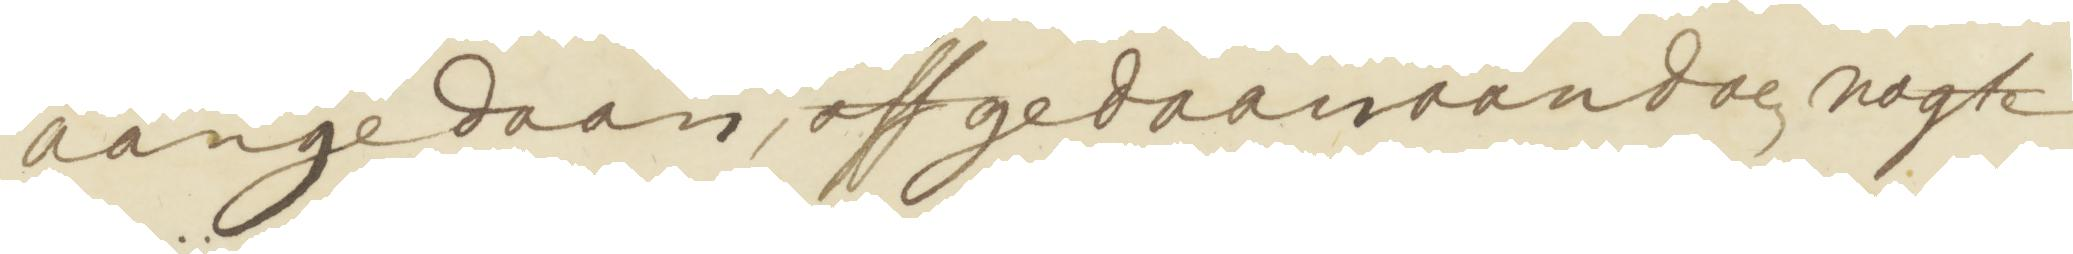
aangedaan, off gedaan aan doen nogte
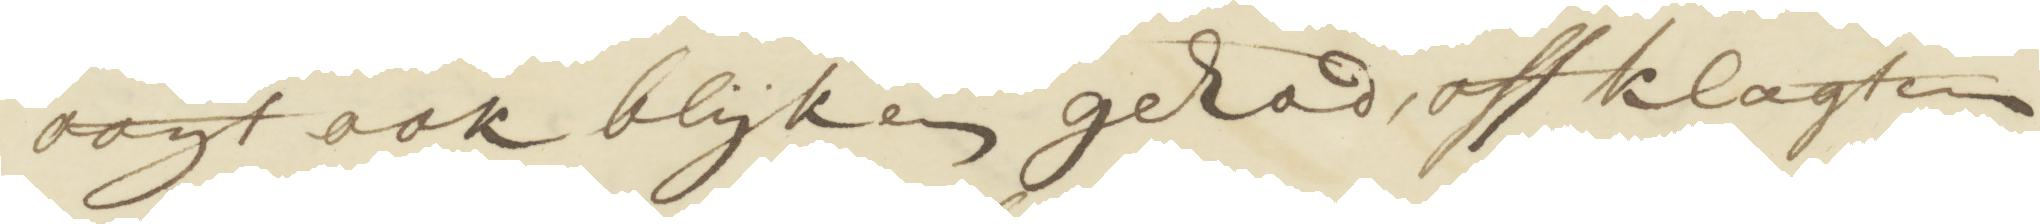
ooijt ook blijken gehad, off klagten
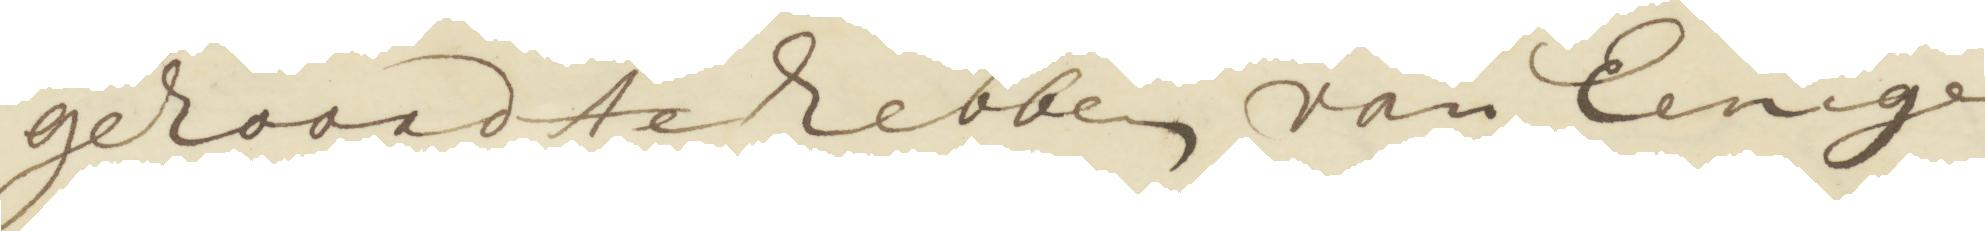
gehoord te hebben van Eenige
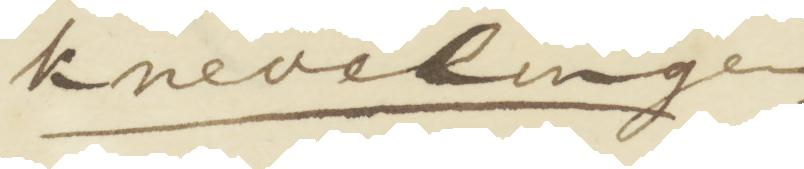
knevelingen
